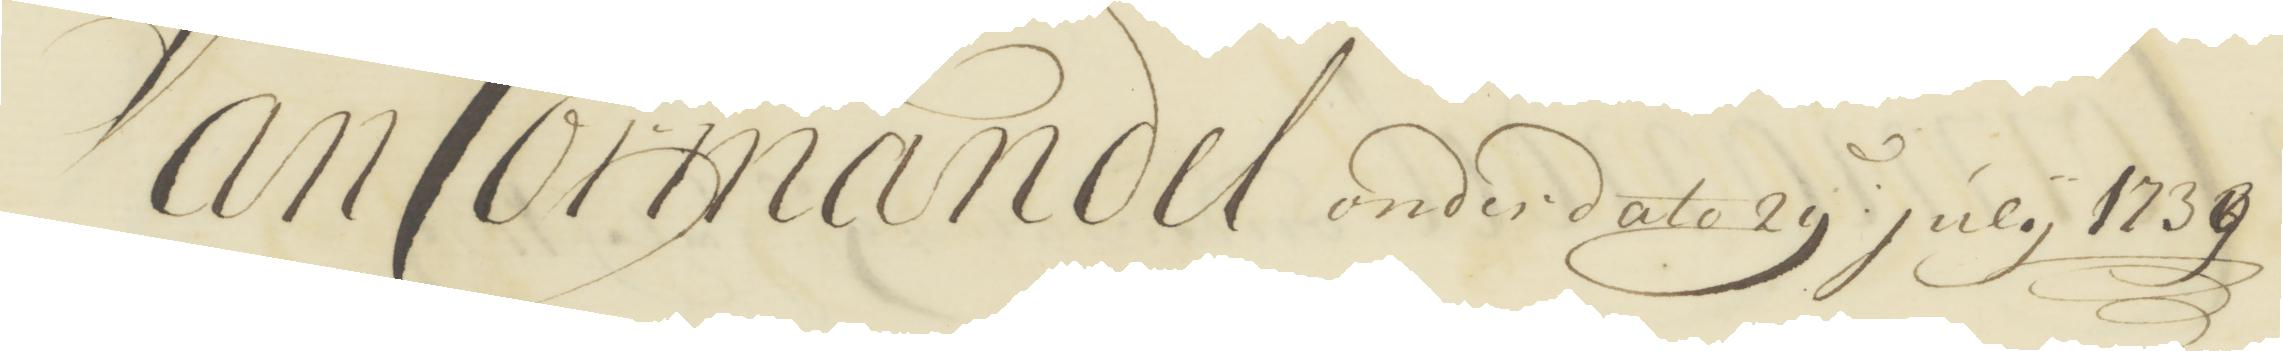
Van Cormandel onder dato 29:en julij 1739
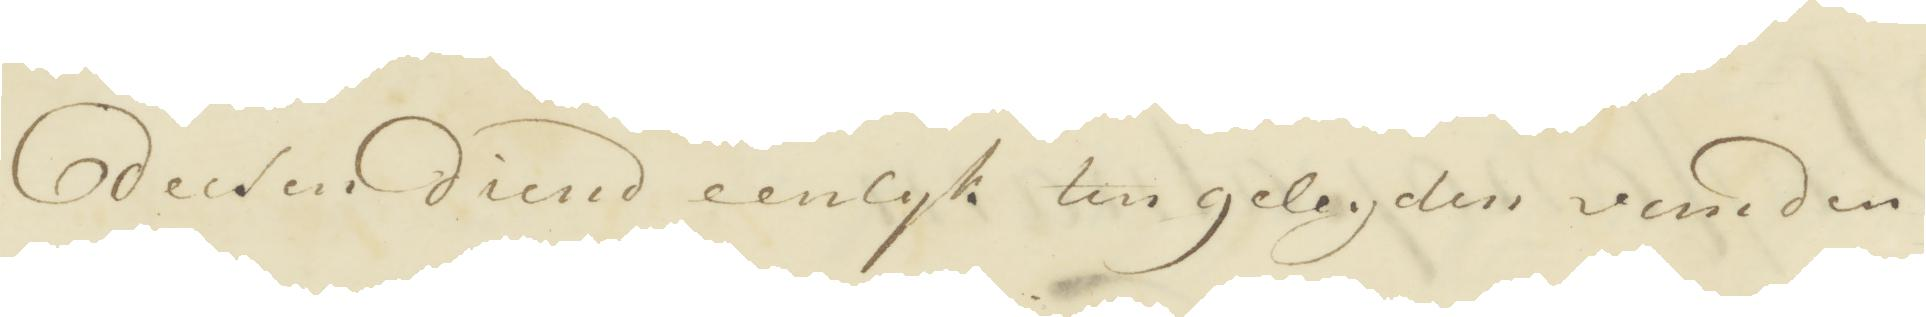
deesen diend eenlyk ten geleyden van den
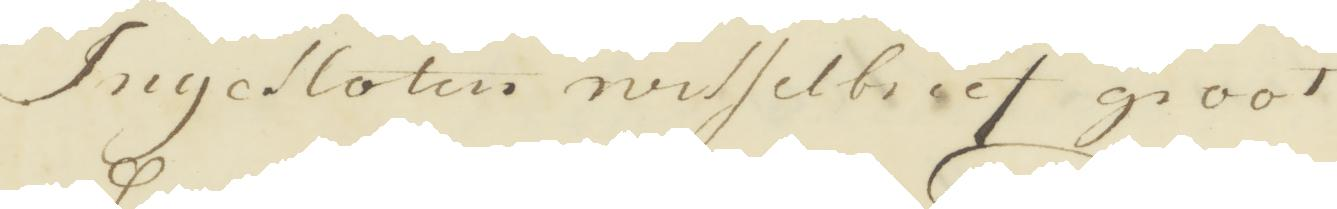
Ingesloten wisselbrief groot
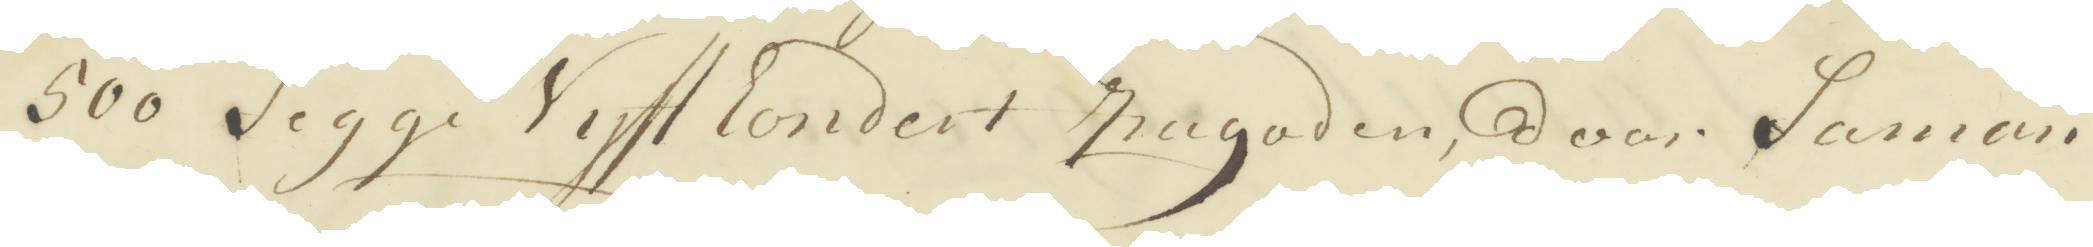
500 Segge Vyff hondert pagoden, door Saman
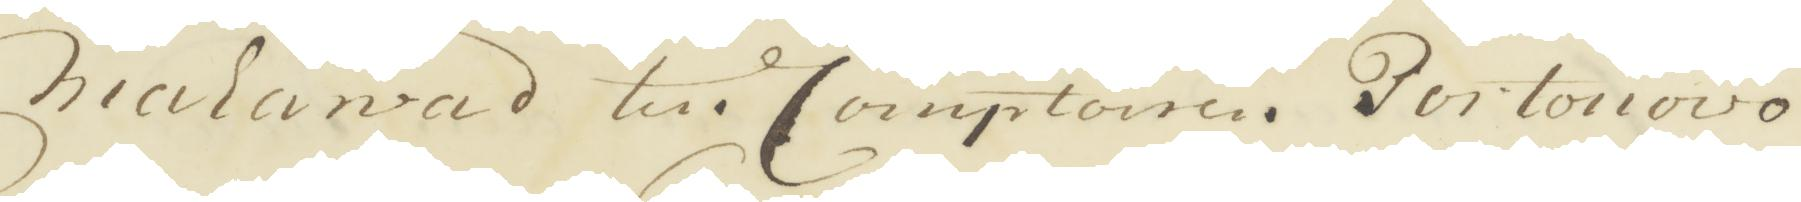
Mahawad ten Comptoiren Portonovo
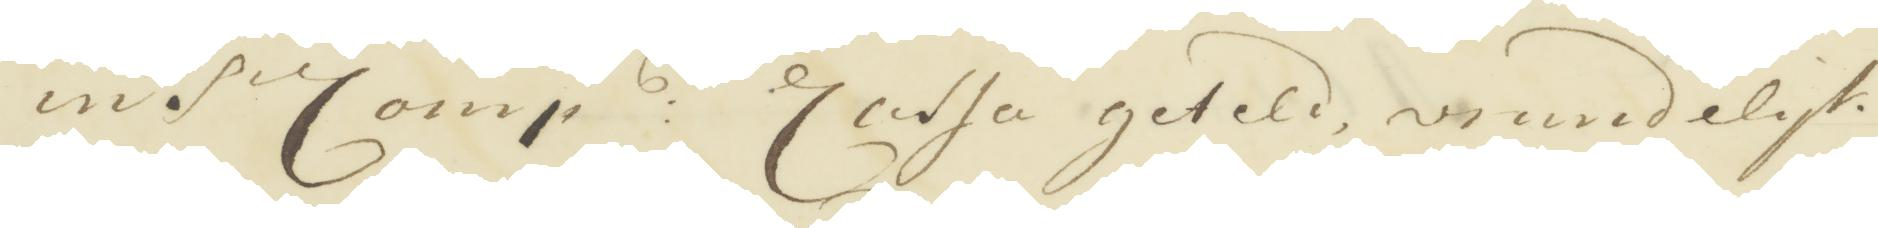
in 'S Comp:s Cassa geteld, vrundelijk
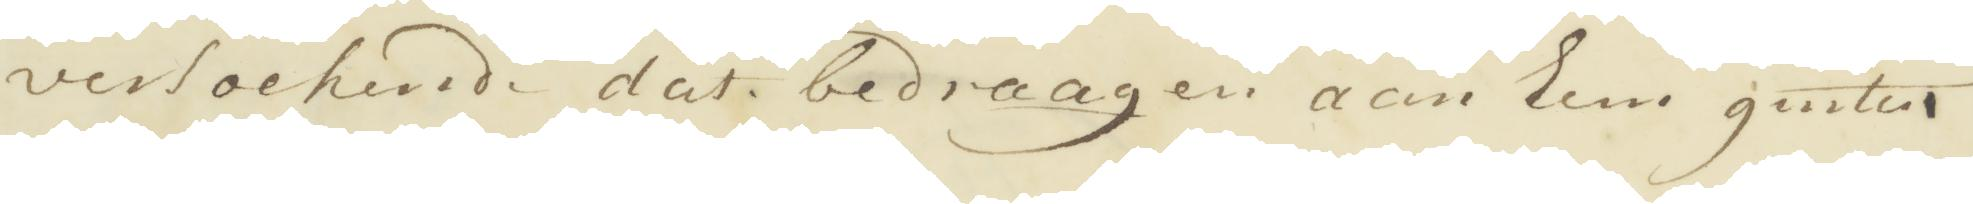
versoekende dat bedraagen aan hem ginter
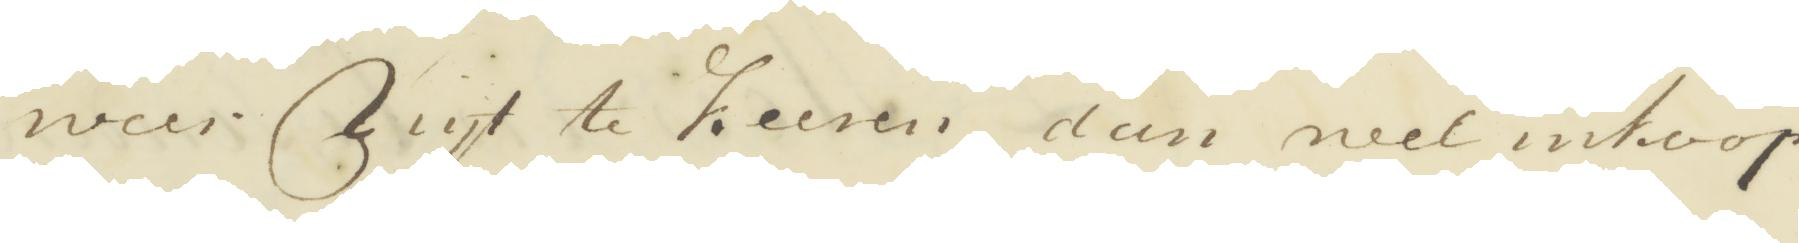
weer uijt te keeren, dan wel inkoop
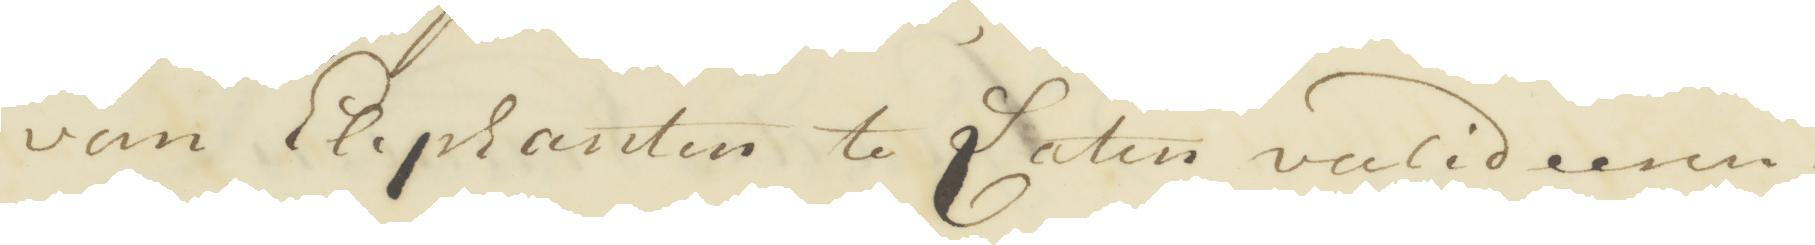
van Eliphanten te Laten valideeren
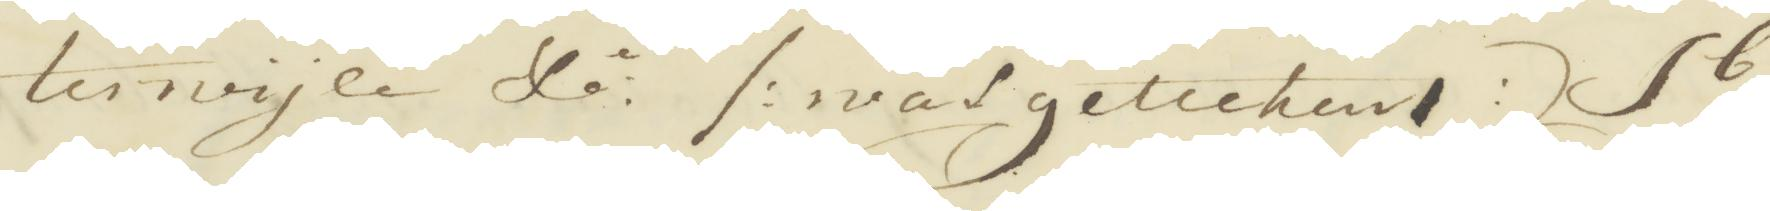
terwijle &:a /:was geteekent:/ I:b
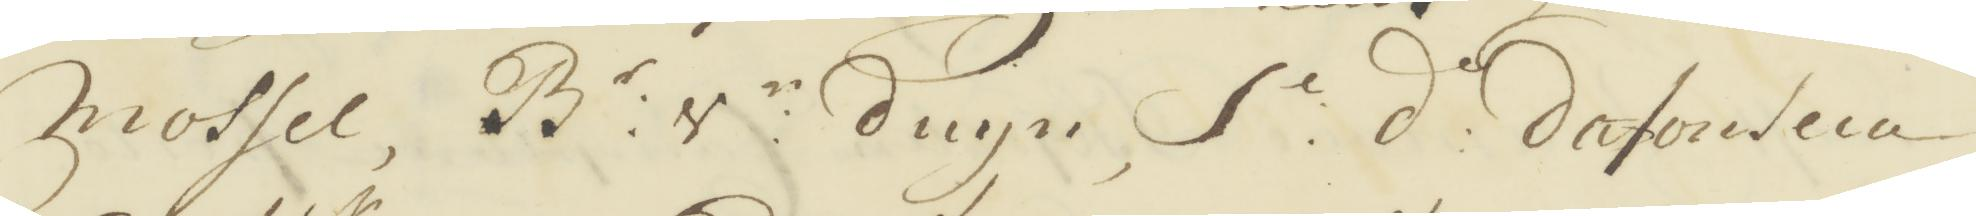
mossel, B:s v:n duyn, I:c d:s dafonseca
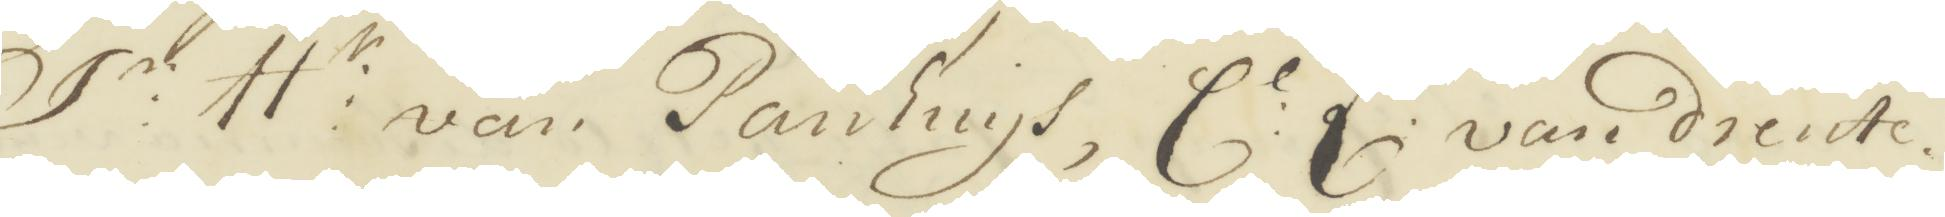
J:n H:k van Panhuijs, C:l C:k van drente„
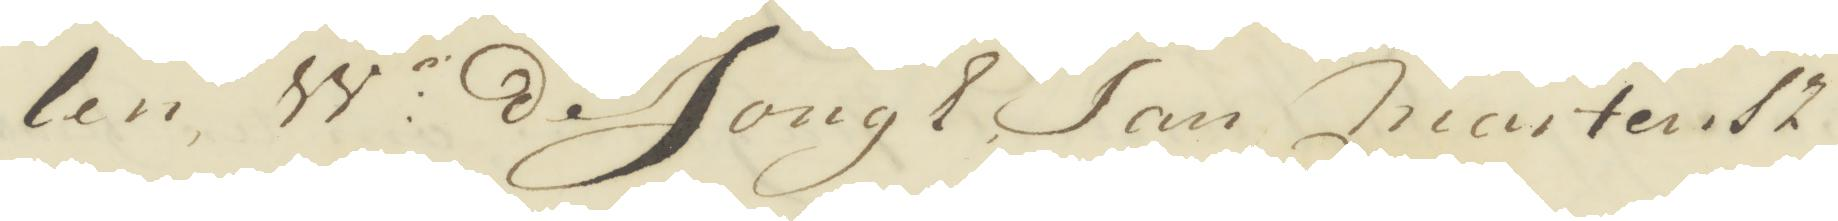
len, W:r de Jongh, Ian martensz,
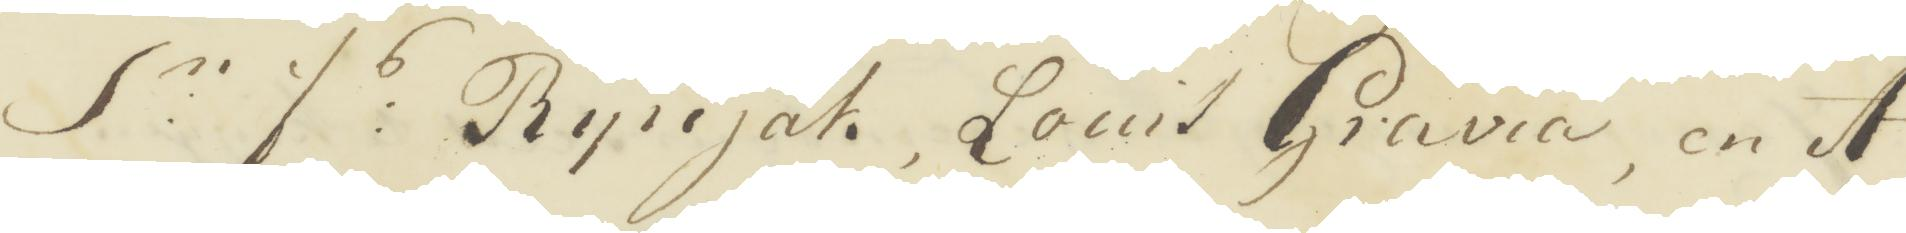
I:n f:s Rijnjak, Louis Gravia, en A=m
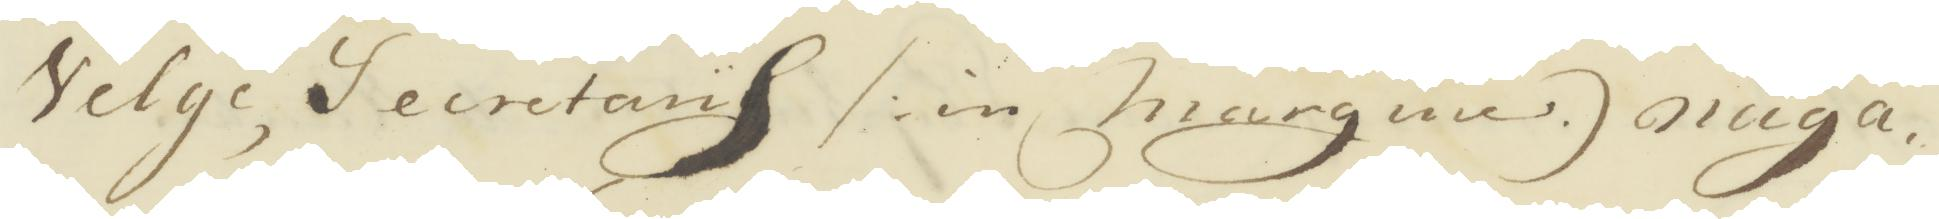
Velge, Secretaris /:in margine:/ naga„
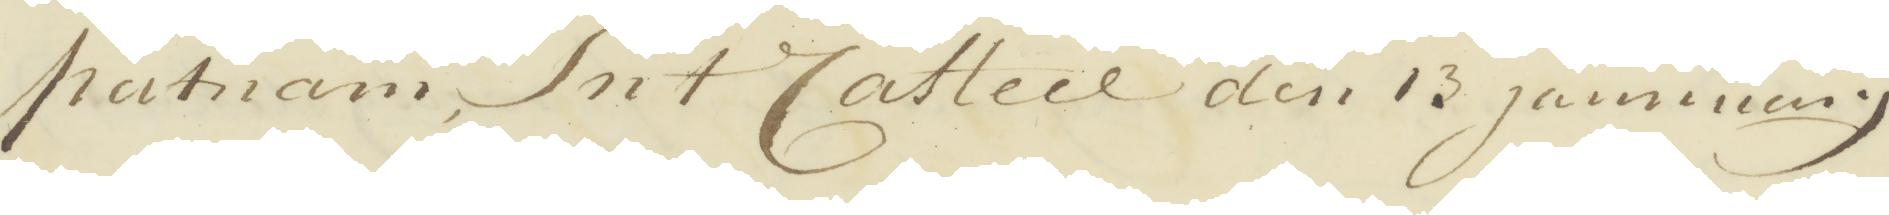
patnam, In t Casteel den 13 Jannuarij
